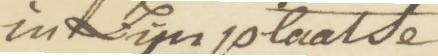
in zijn plaatse
